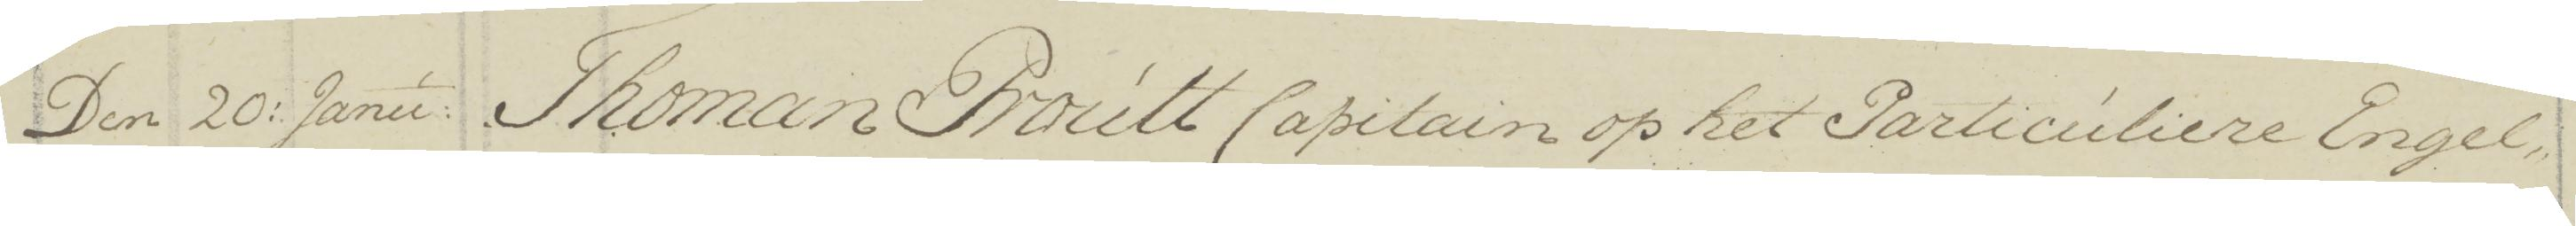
Den 20: Janu: Thoman Proutt Capitain op het Particuliere Engel„
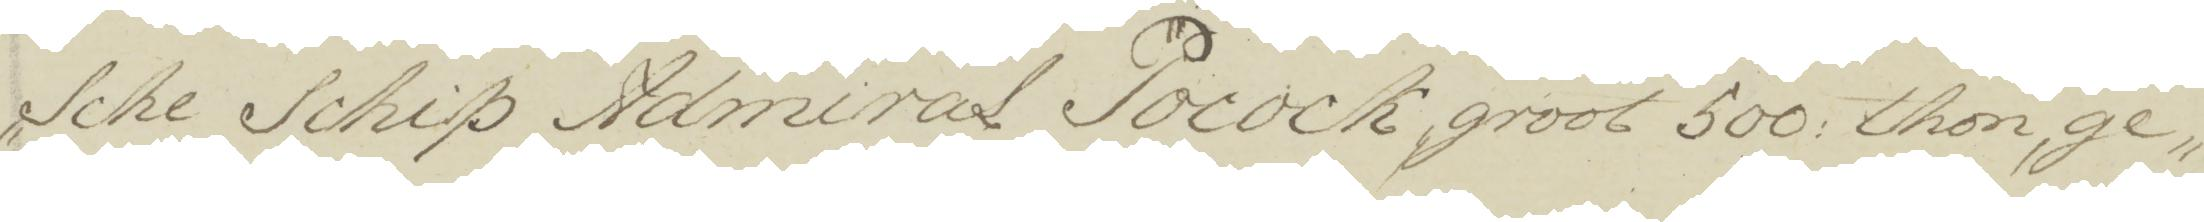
„sche schip Admiral Pocock, groot 500: thon, ge„
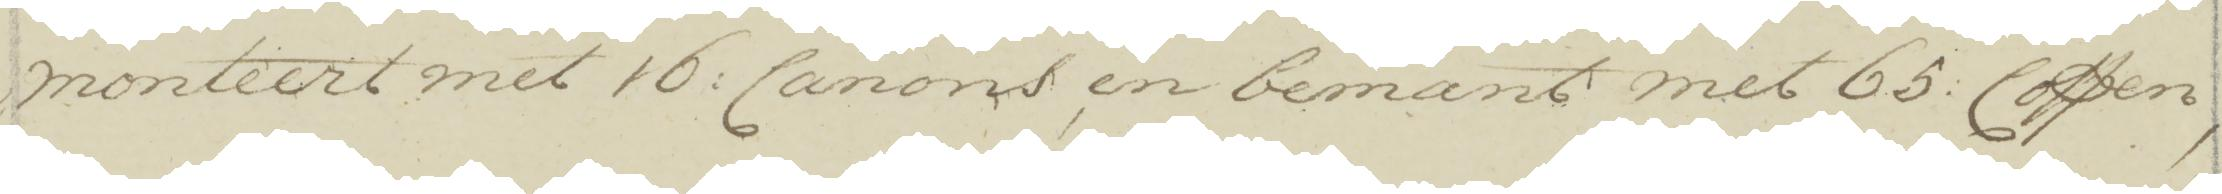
„monteert met 16: Canons, en bemant met 65: Coppen,
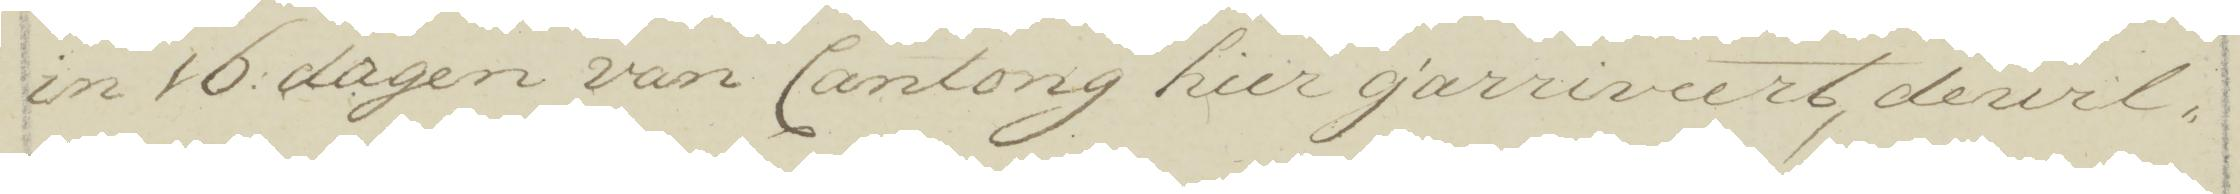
in 16: dagen van Cantong hier g'arriveert, dewil„
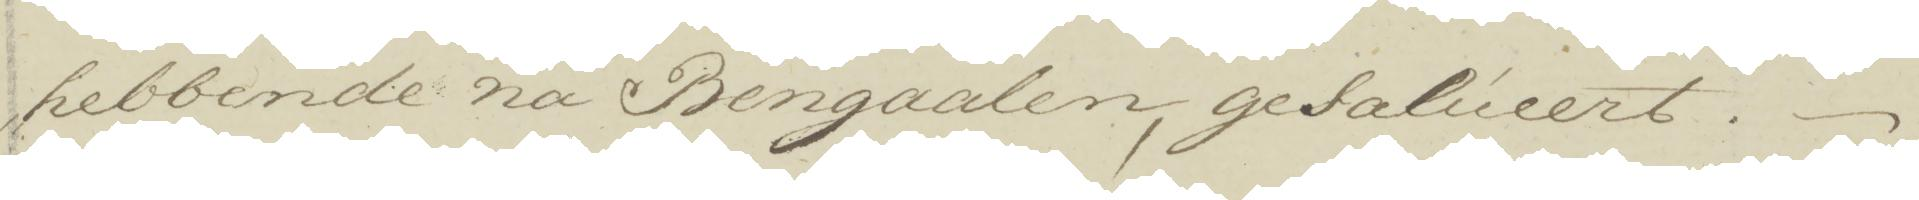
„hebbende na Bengaalen, gesalueert.—
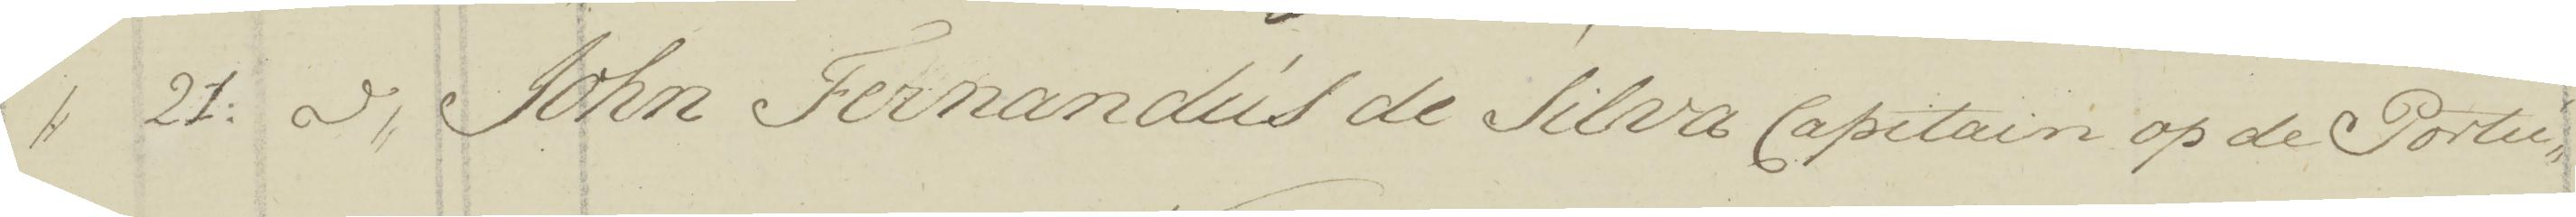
„ 21: d„o John Fernandus de Silva Capitain op de Portu„
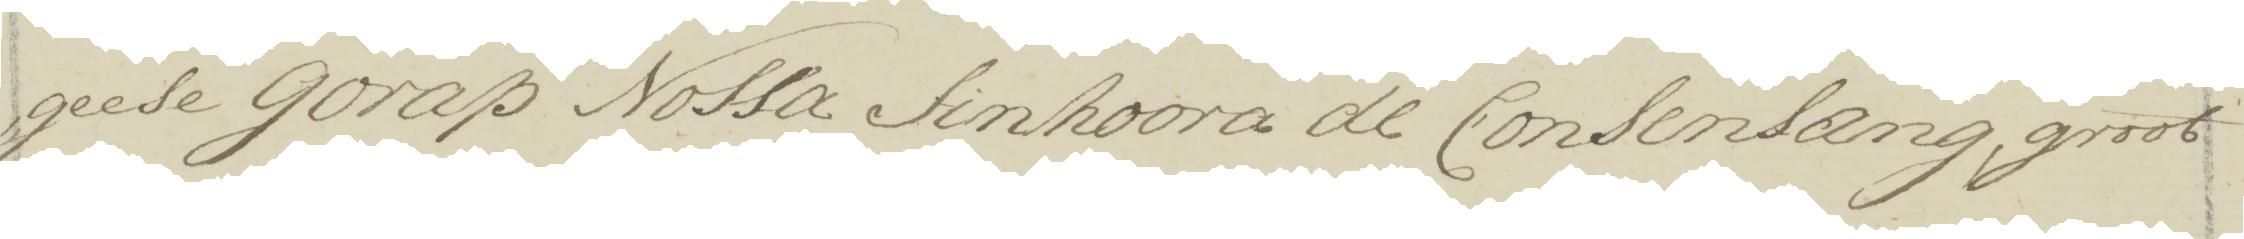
„geese Gorap Nossa Sinhoora de Consensang, groot
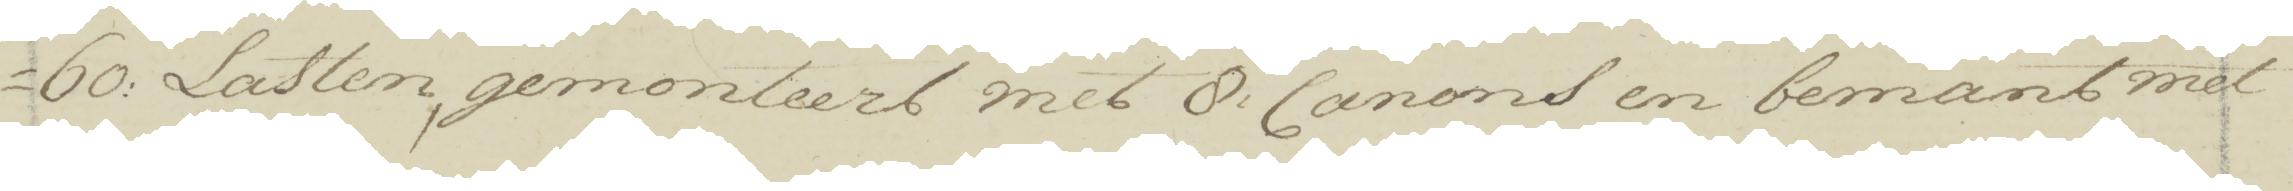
=60: Lasten, gemonteert met 8: Canons en bemant met
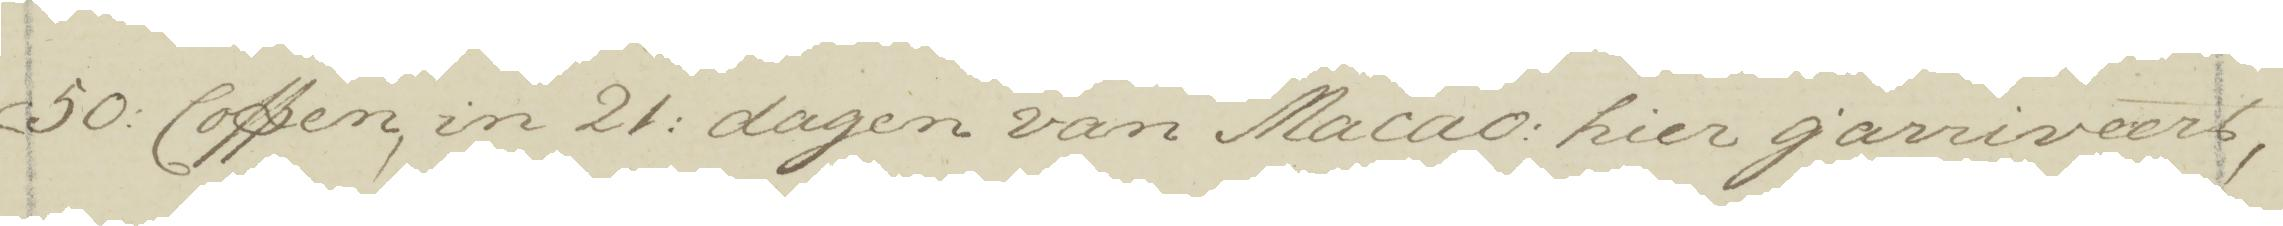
=50: Coppen, in 21: dagen van Macao: hier g'arriveert,
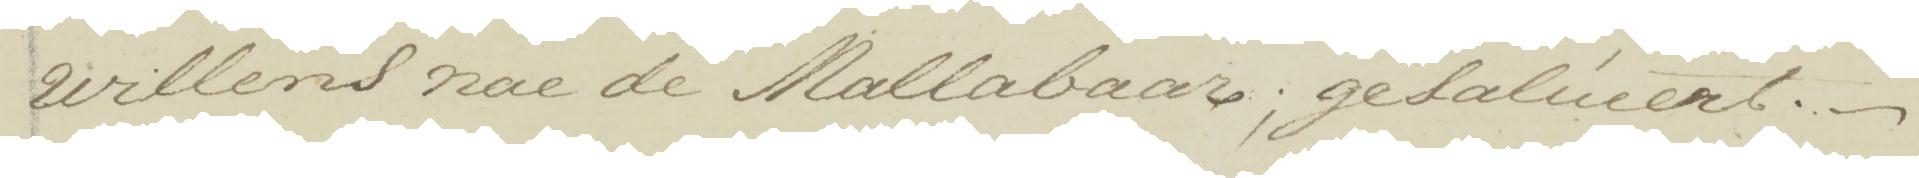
willens nae de Mallabaar; gesalueert.—
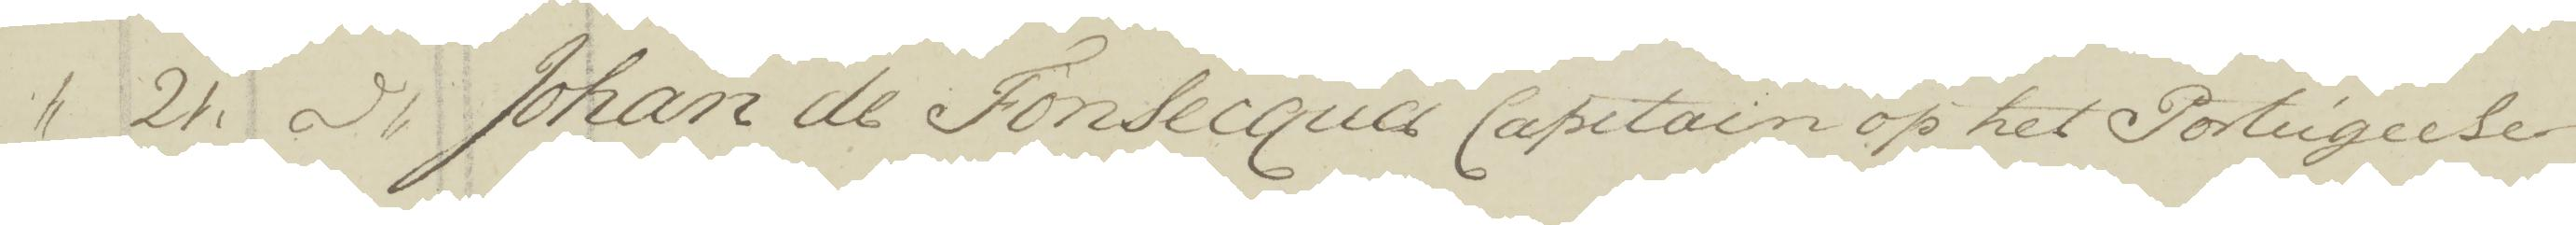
„ 21. d„o Johan de Fonsecqua Capitain op het Portugeese-
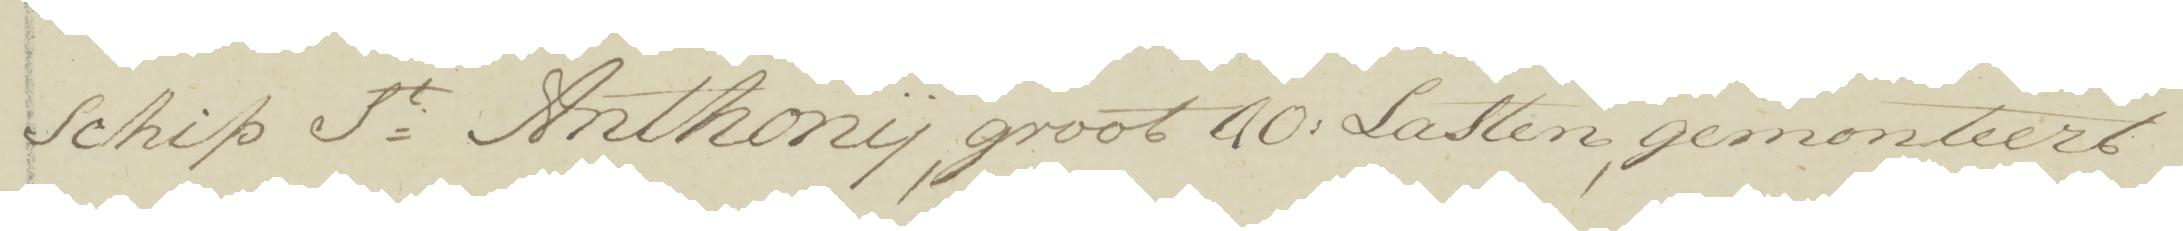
schip S=t. Anthonij, groot 40: Lasten, gemonteert
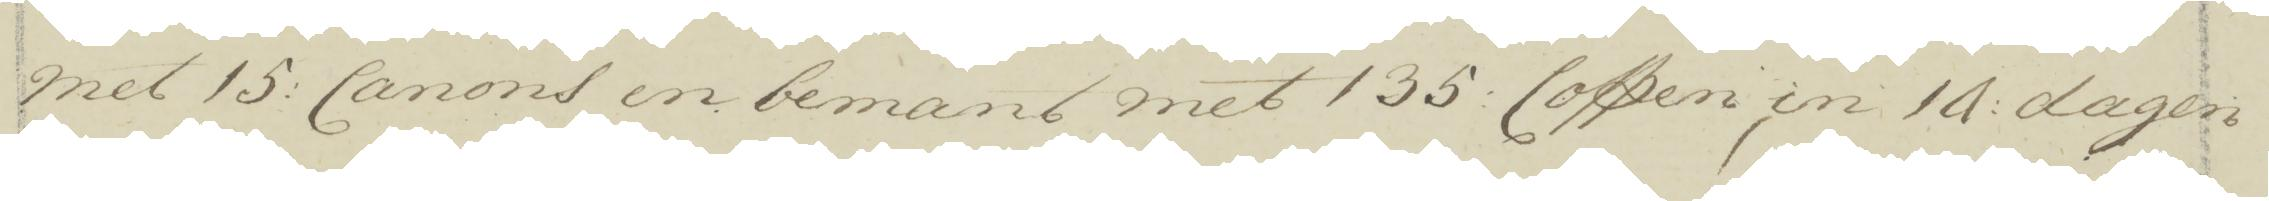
met 15: Canons en bemant met 135: Coppen, in 14: dagen
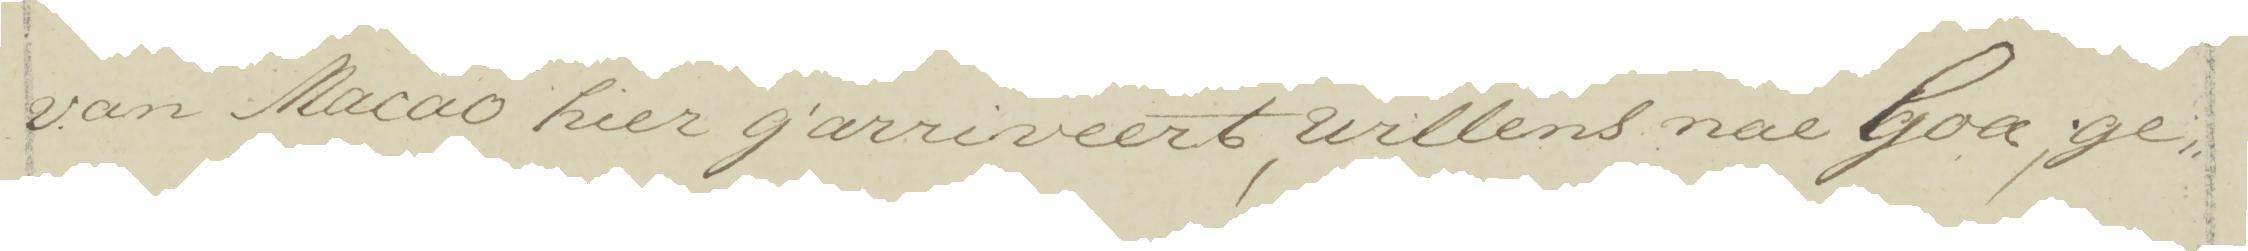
van Macao hier g’arriveert, willens nae Goa, ge„
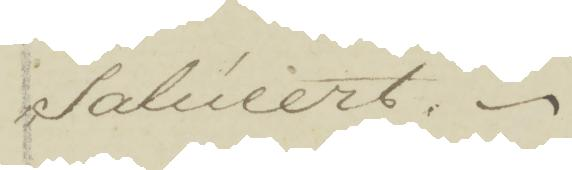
„salueert.—
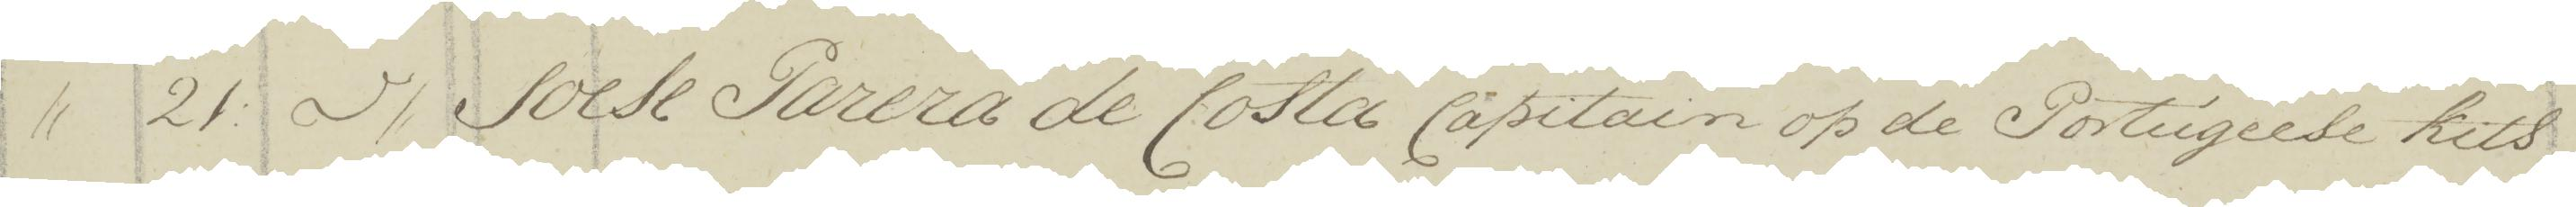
„ 21: d„' Soese Parera de Costa Capitain op de Portugeese kits
